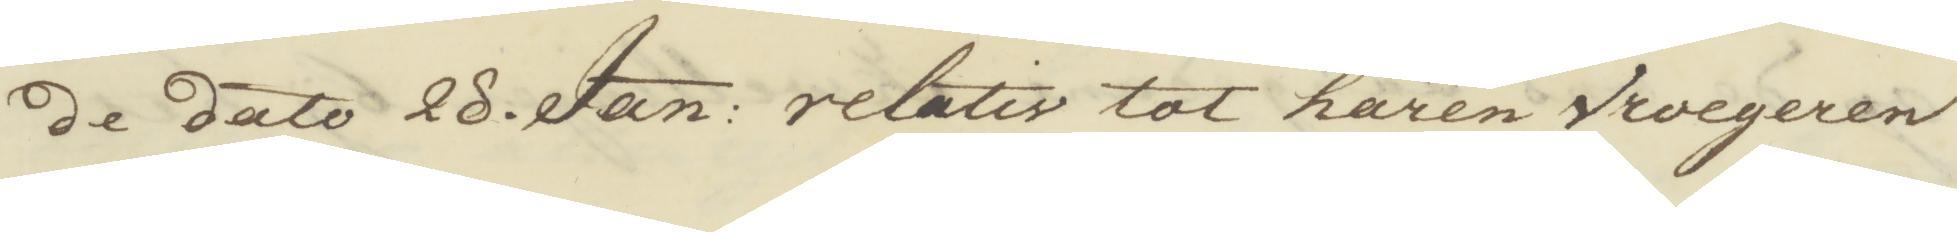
de dato 20. Ian: relativ tot haren Vroegeren
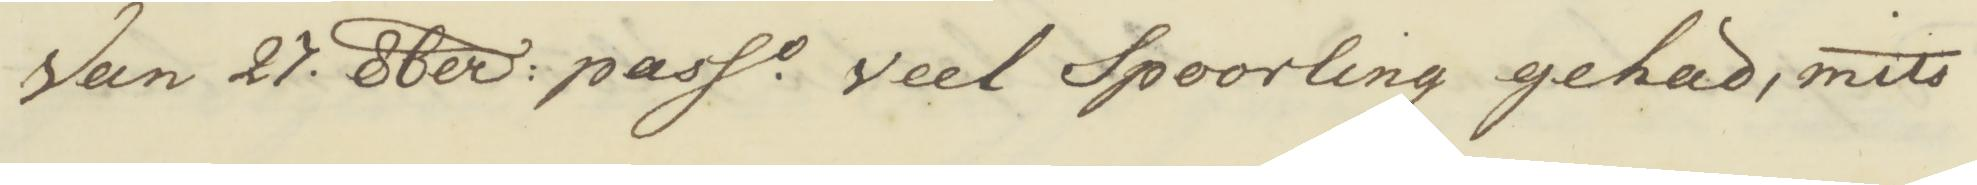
Van 27. 8ber: pass:o veel Spoorling gehad, mits
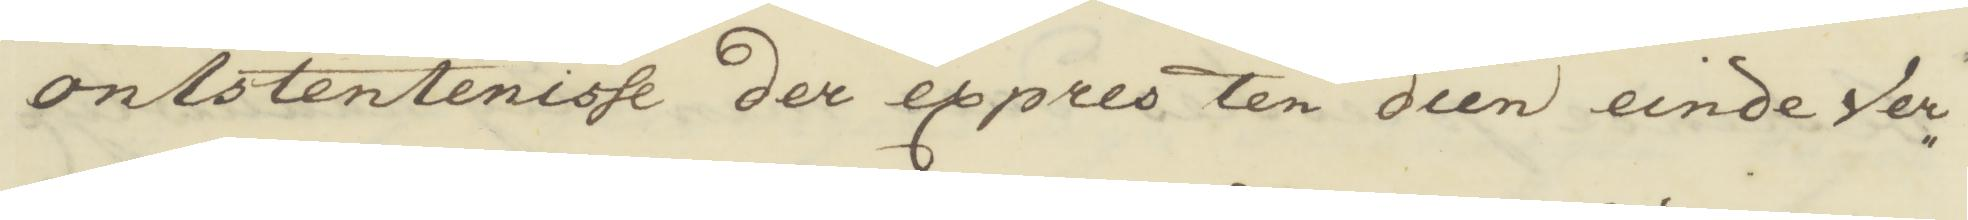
ontstentenisse der expres ten dien einde Ver„
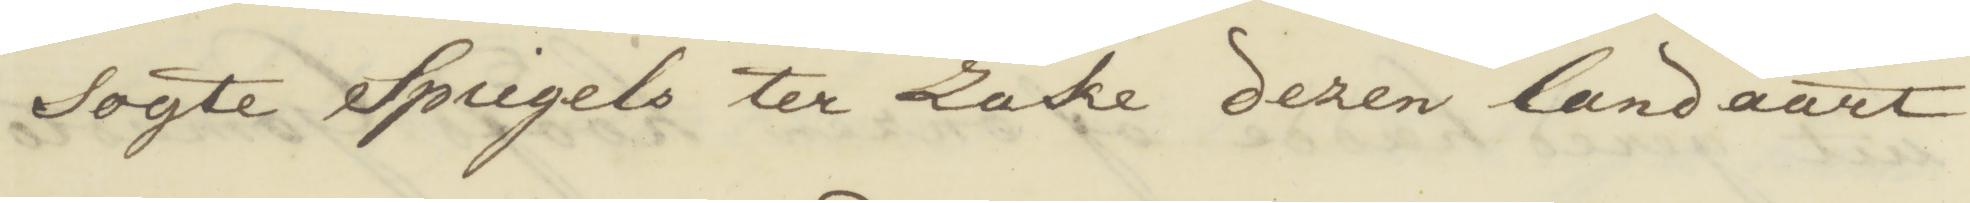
sogte Spiegels ter zake dezen landaart
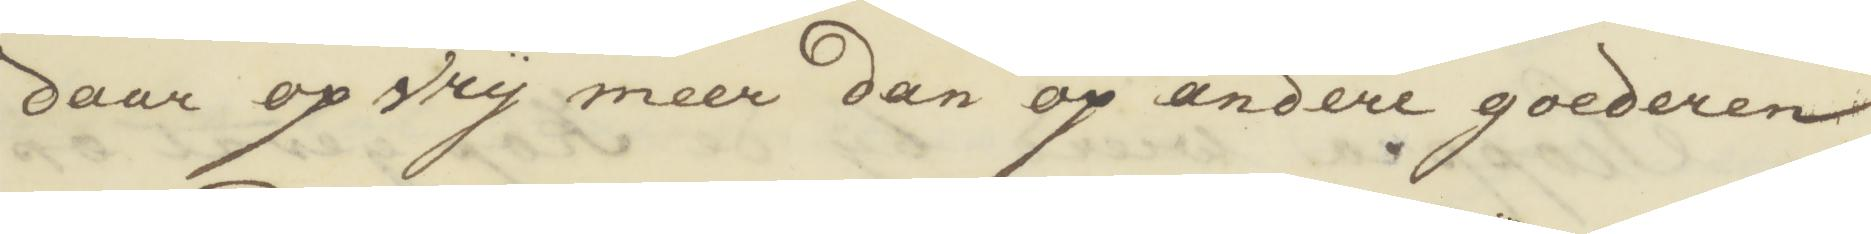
daar op vrij meer dan op andere goederen
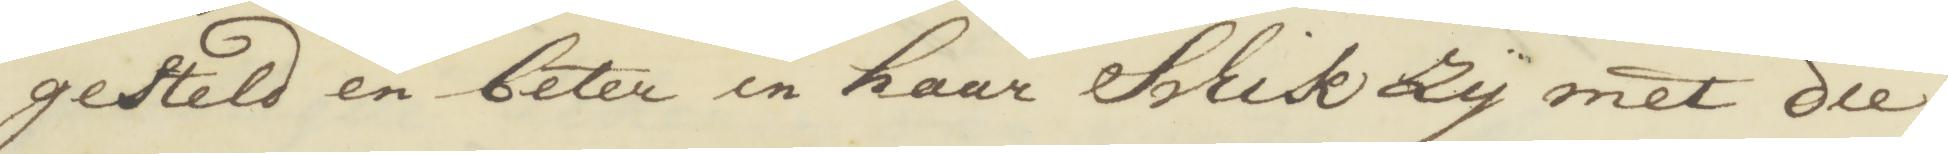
gesteld en beter in haar schik Zij met die
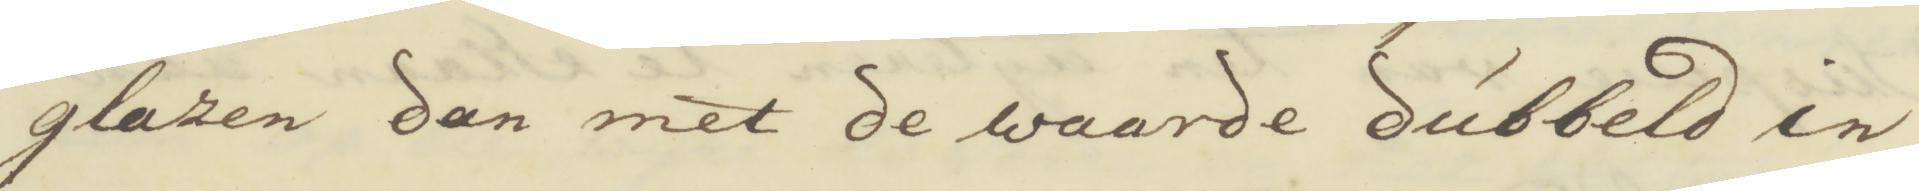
glazen dan met de waarde dubbeld in
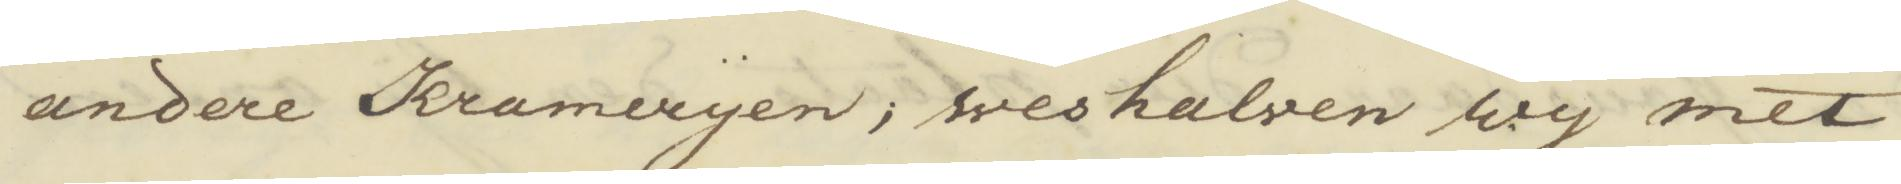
andere Kramerijen; weshalven hij met
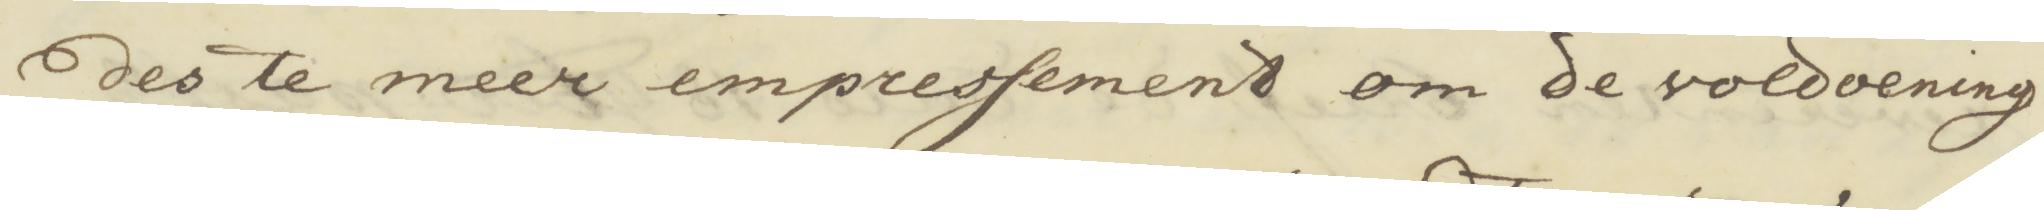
des te meer empressement om de voldoening
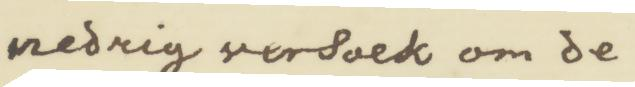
nedrig versoek om de
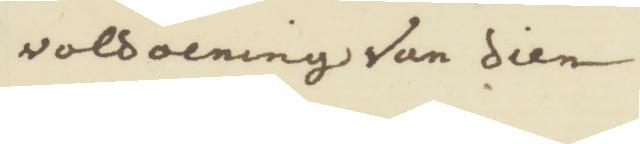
voldoening van dien
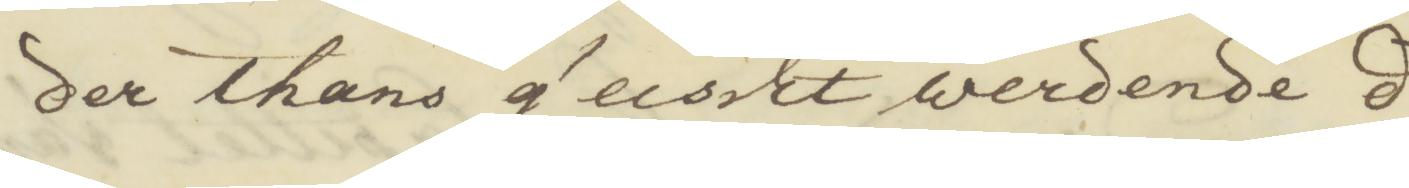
der thans g’eischt werdende d:too Zo voor
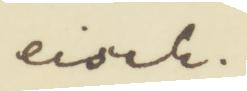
eisch.
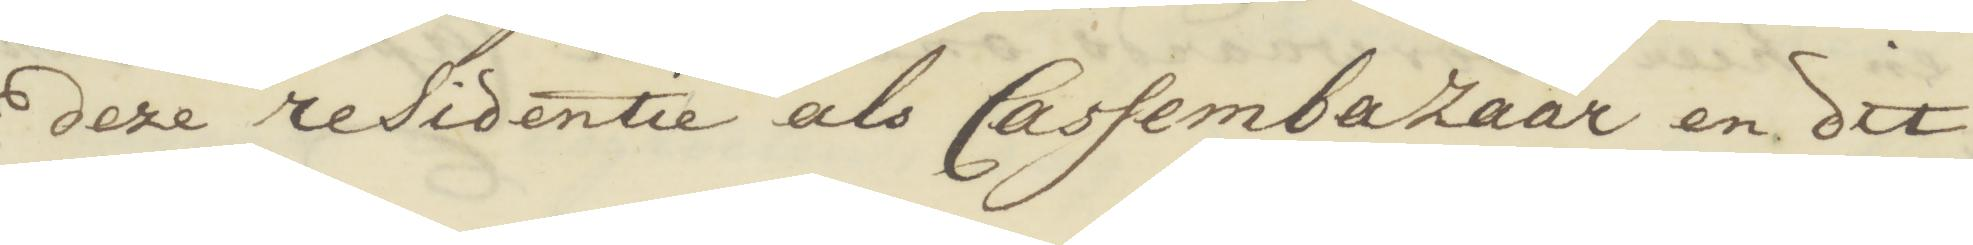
deze residentie als Cassembazaar en dit
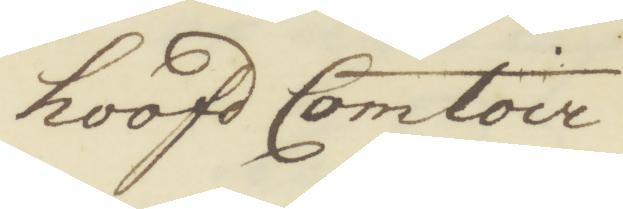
hoofd Comtoir
